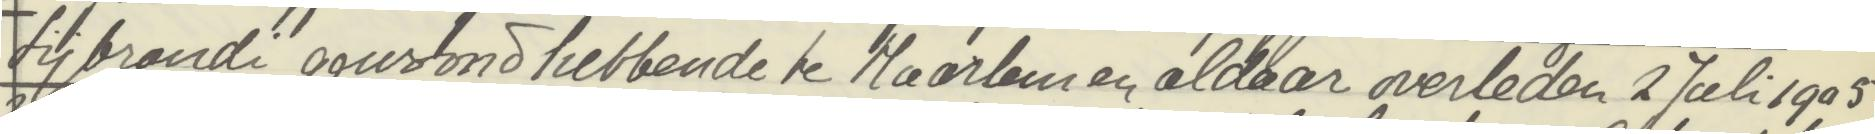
Sijbrandi, gewoond hebbende te Haarlem en aldaar overleden 2 Juli 1905
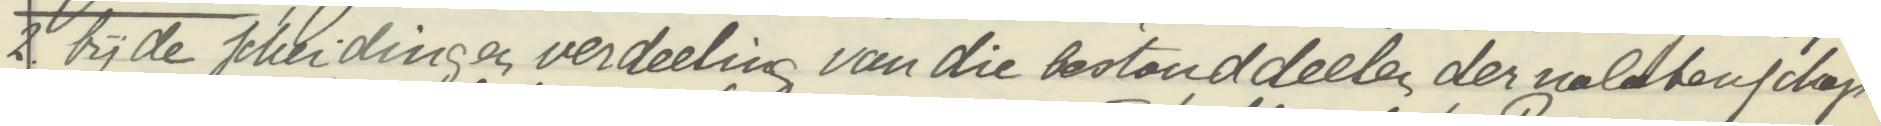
2. bij de scheiding en verdeeling van die bestanddeelen der nalatenschap
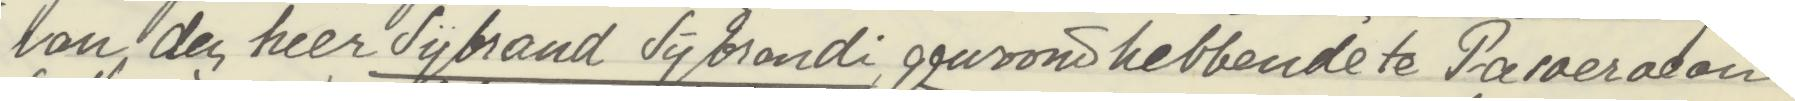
van den heer Sijband Sijbrandi, gewoond hebbende te Pasoeroean
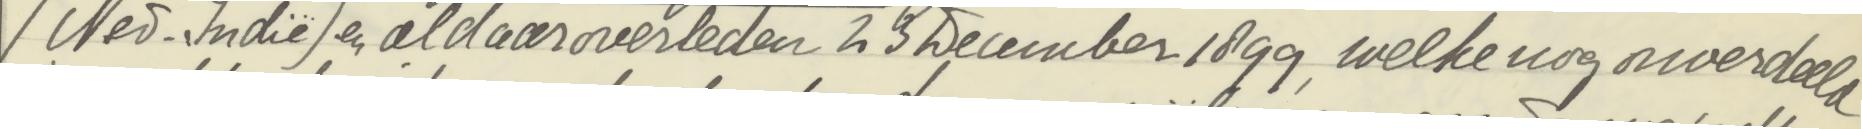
(Ned-Indië) en aldaar overleden 23 December 1899, welke nog onverdeeld
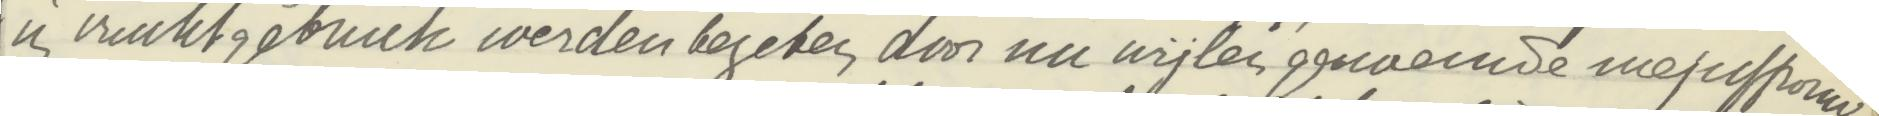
in vruchtgebruik werden bezeten door nu wijlen genoemde mejuffrouw
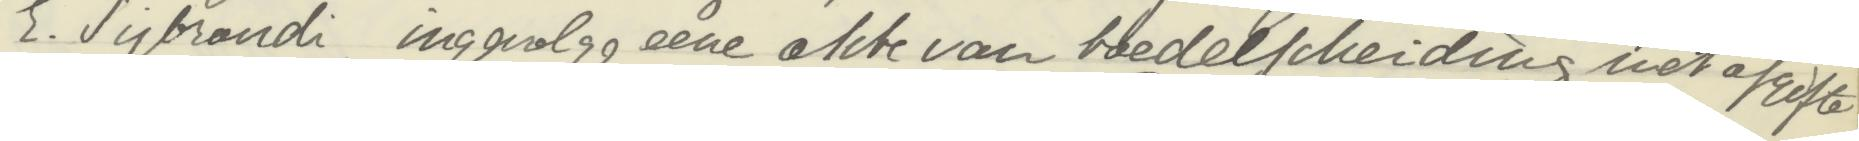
E. Sijbrandi, ingevolge eene akte van boedelscheiding met afgifte
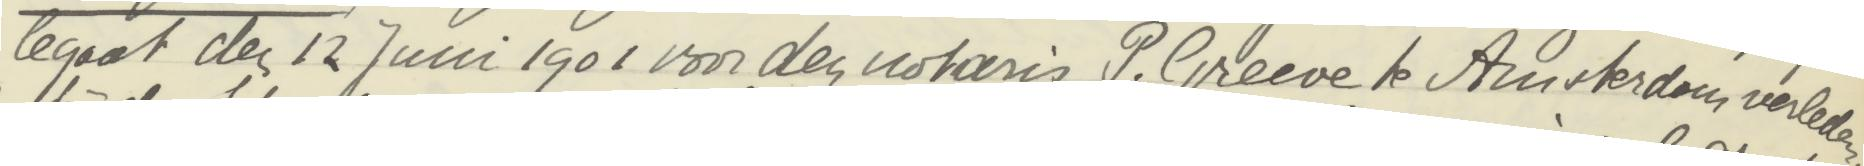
legaat den 12 Juni 1901 voor den otaris P. Greeve te Amsterdam verleden
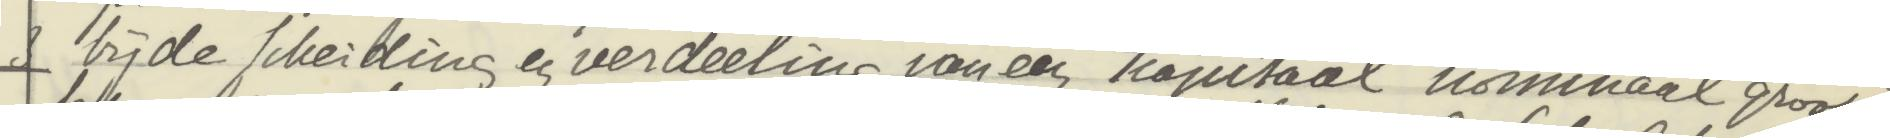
3 bij de scheiding en verdeeling van een kapitaal nominaal groot
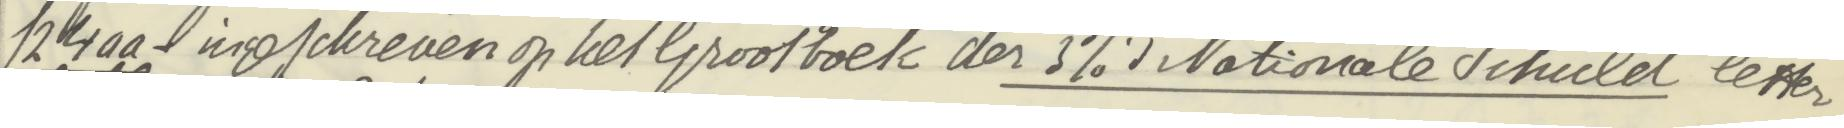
ƒ2400- ingeschreven op het Grootboek der 3% 's Nationale Schuld letter
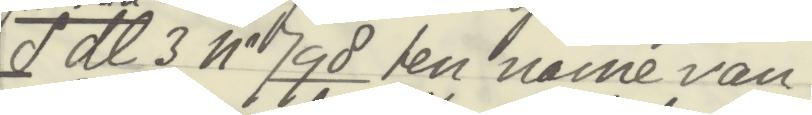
S dl 3 no 798 ten name van
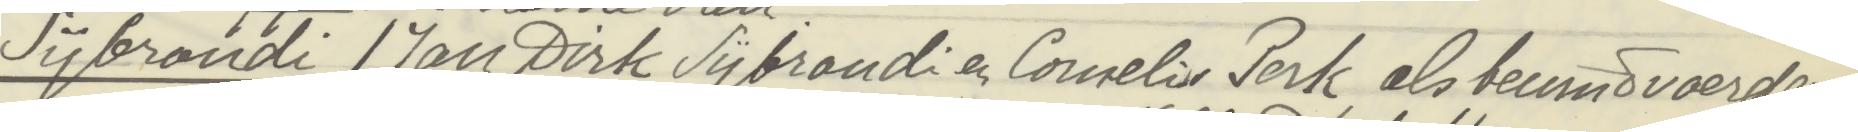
Sijbrandi / Jan Dirk Sijbrandi en Cornelis Perk, als bewindvoerders
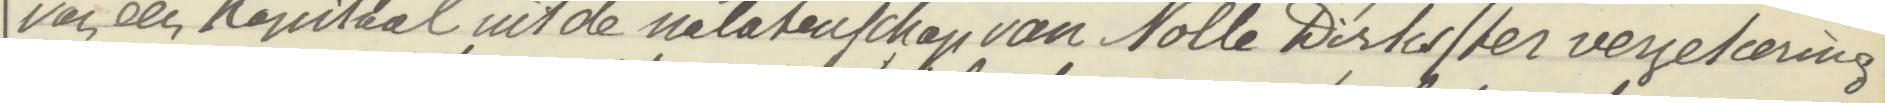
van een Kapitaal uit de nalatenschap van Nolle Dirks / ter verzekering
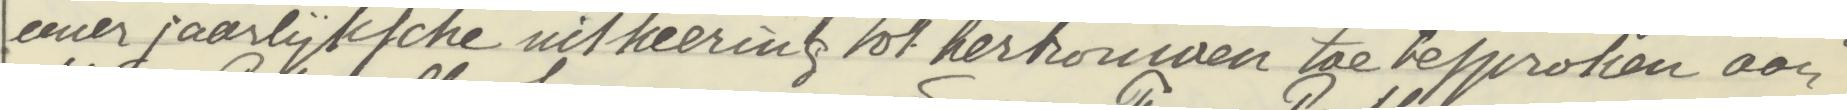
eener jaarlijksche uitkeering tot herbouwen toe besproken aan
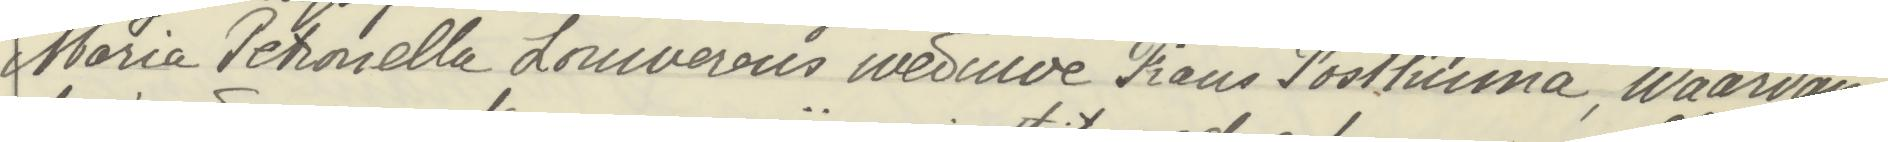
Maria Petronella Louwerens weduwe Frans Posthuma, waarvan
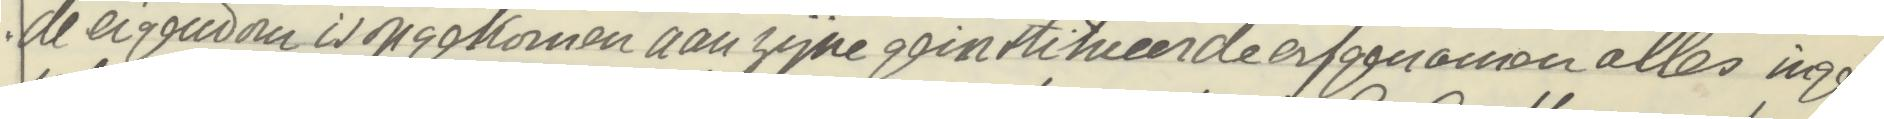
de eigendom is opgekomen aan zijne geinstitueerde erfgenamen alles inge
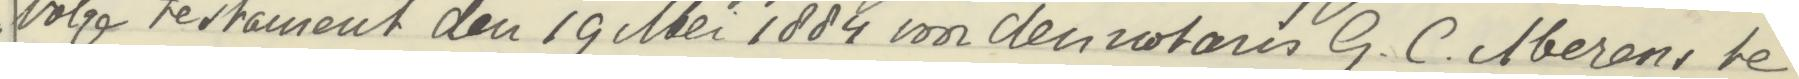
volge testament den 19 Mei 1884 voor den notaris G. C. Merens te
